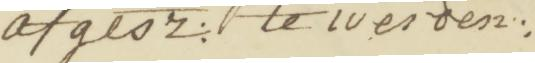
afgesz: te werden:
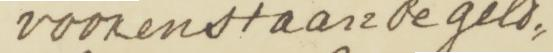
voorenstaan de geld„
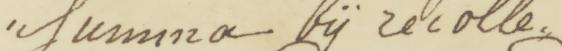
„summa bij recolle„
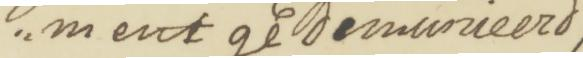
„ment gedimunieerd
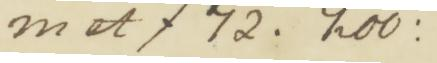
met ƒ72.200:
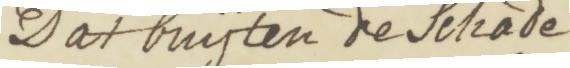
Dat buijten de schade
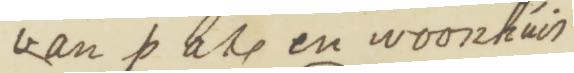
van pak en woonhuis
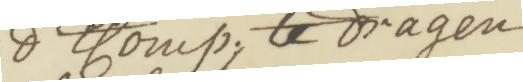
d 'EComp: te dragen
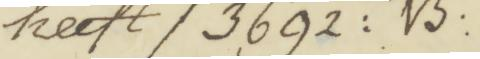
heeft ƒ 3692:13:
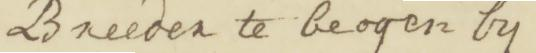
Breeder te beogen by
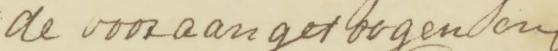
de vooraan getoogen en
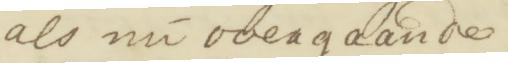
als nu overgaande
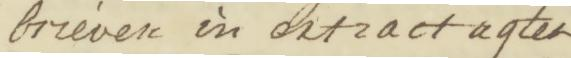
brieven in extract agter
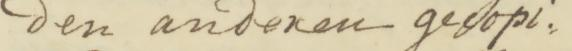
den anderen gecopi„
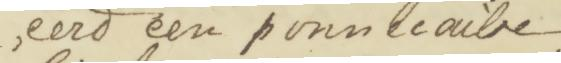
„eerd een ponnecailse
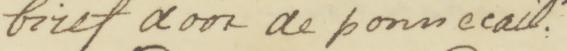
brief door de ponnecail„
